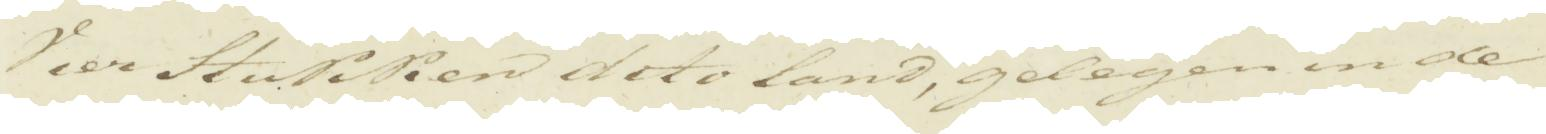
Vier Stukken dito land, gelegen in de
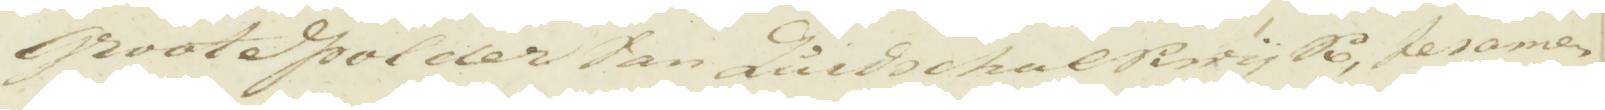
Groote Polder van Zuidschalkwijk, tesamen
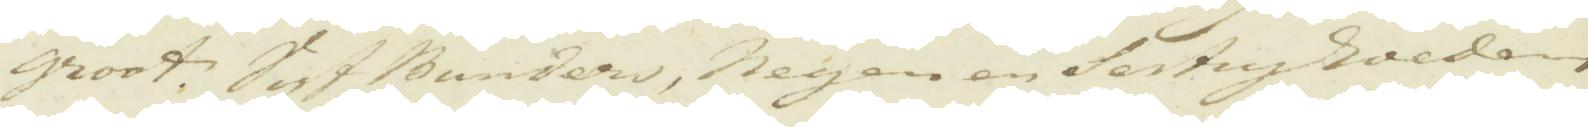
Groot Vyf Bunders, Negen en Sestig Roeden
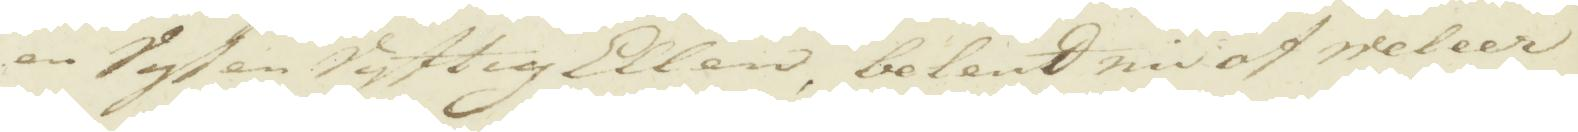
en Vyf en Vyftig Ellen, belend nu of weleer
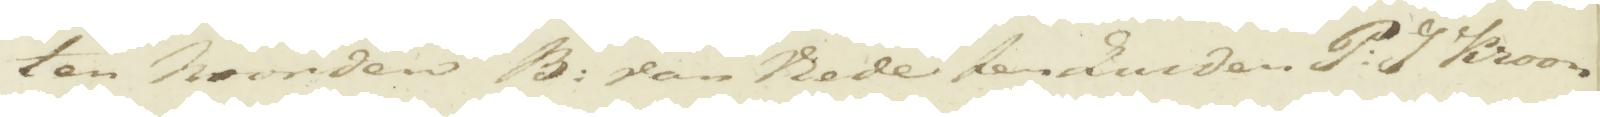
ten Noorden B: van Vrede ten Zuiden P: I Kroon
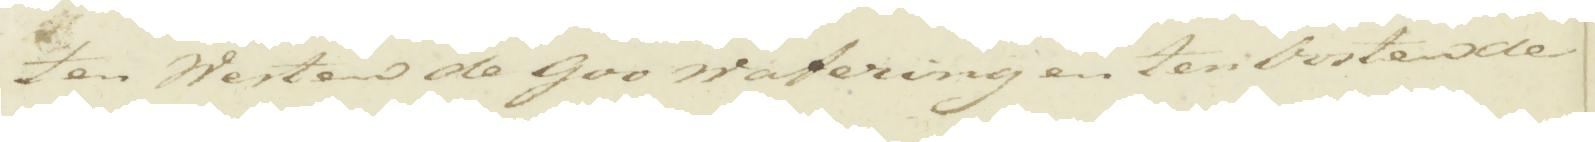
ten Westen de goo watering en ten Oosten de
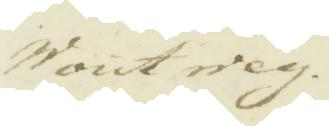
Woutweg.
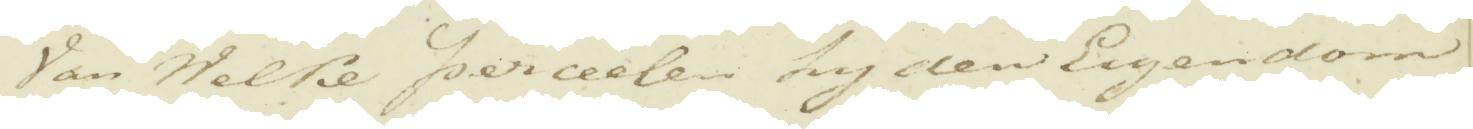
Van welke perceelen hy den Eigendom
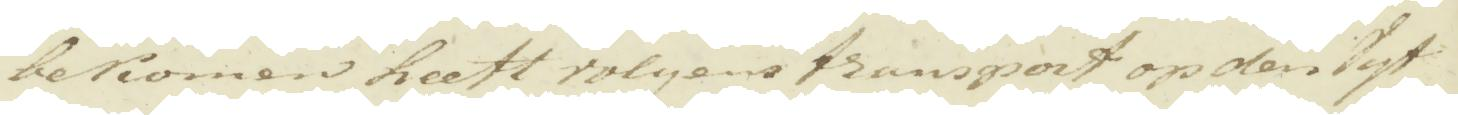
bekomen heeft volgens transport op den Vyf
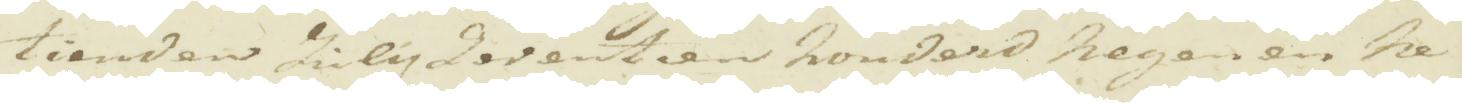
tienden Julij Zeventien honderd negen en ne
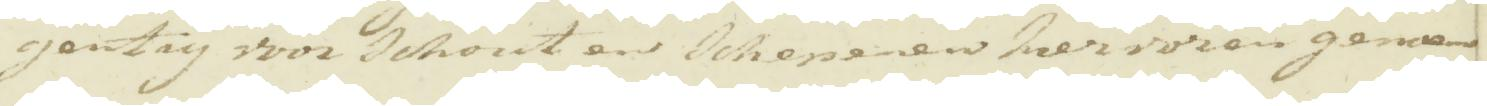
gentig voor schouten schepenen hier voren genoem
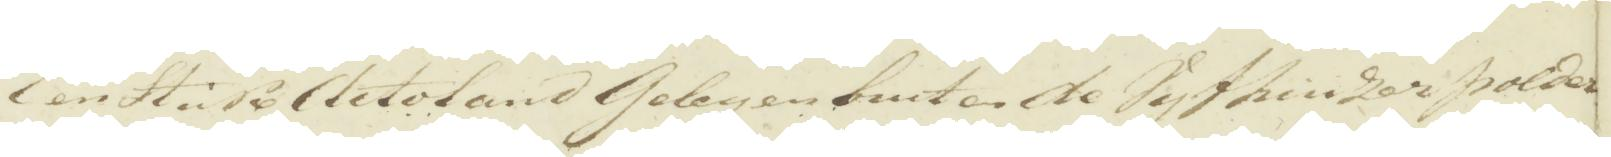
Een Stuk Dito land Gelegen buiten de Vyfhuizer polder
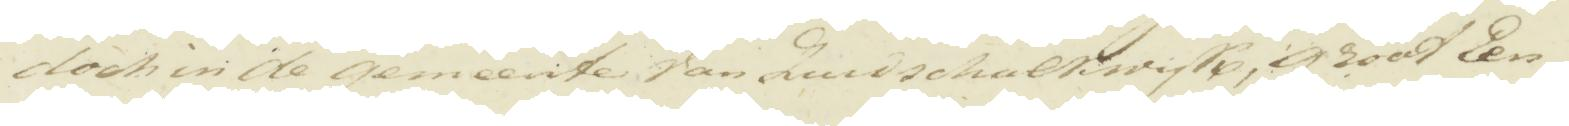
doch in de gemeente van Zuidschalkwijk, groot Een
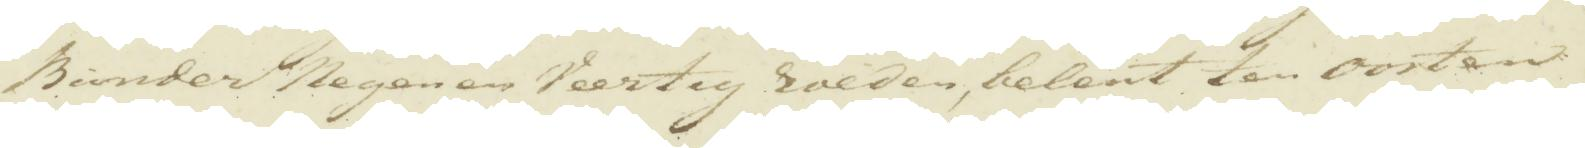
Bunder Negen en Veertig Roeden, belent ten oosten
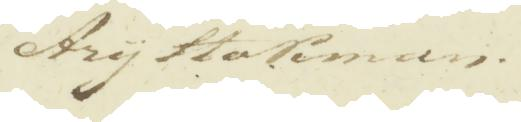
Arij Stokman.
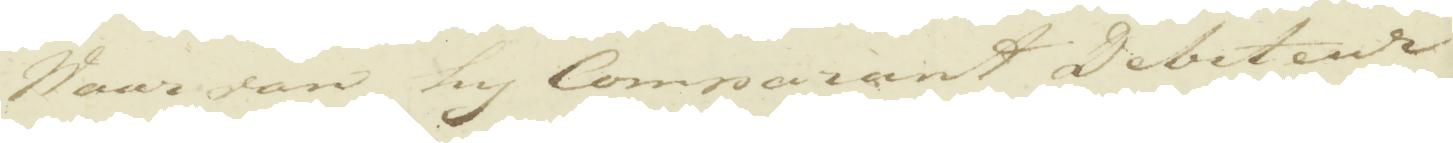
Waar van hy Comparant Debiteur
